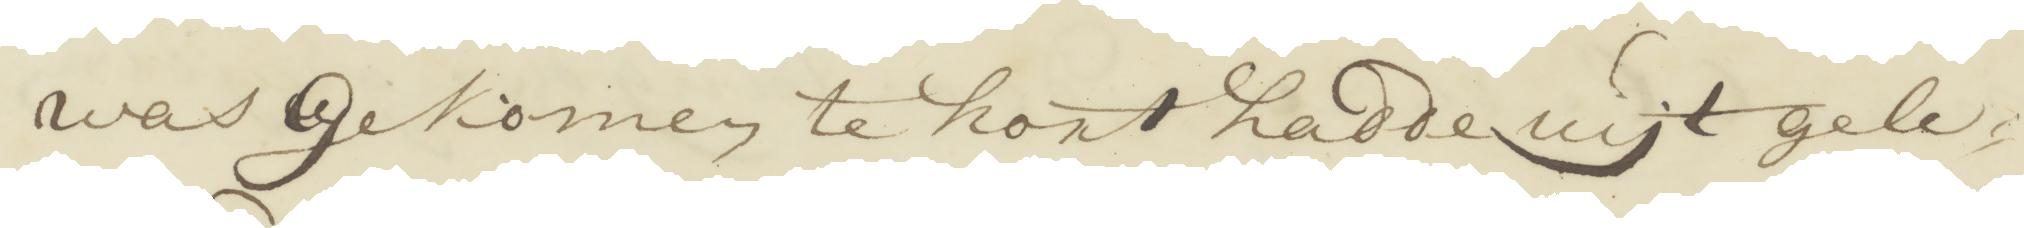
was gekomen te kort hadde uijt gele„
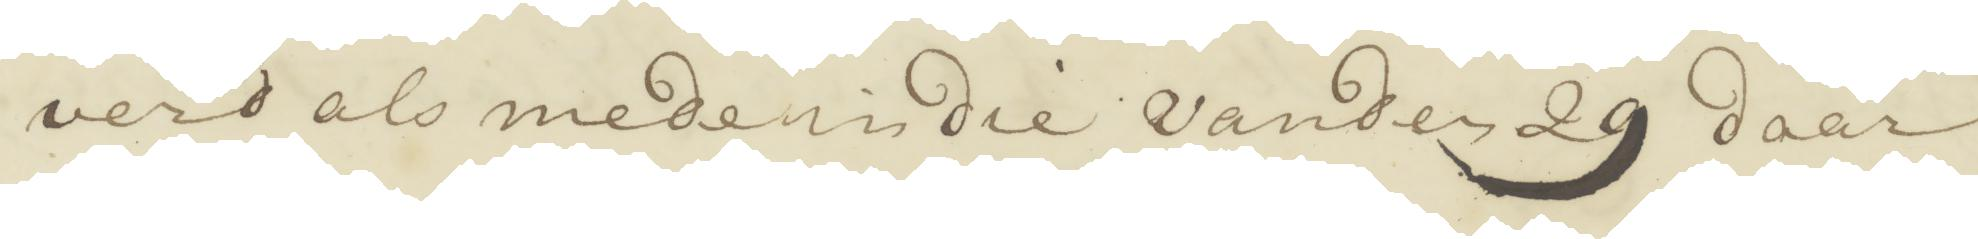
verd als mede in die van den 29 daar
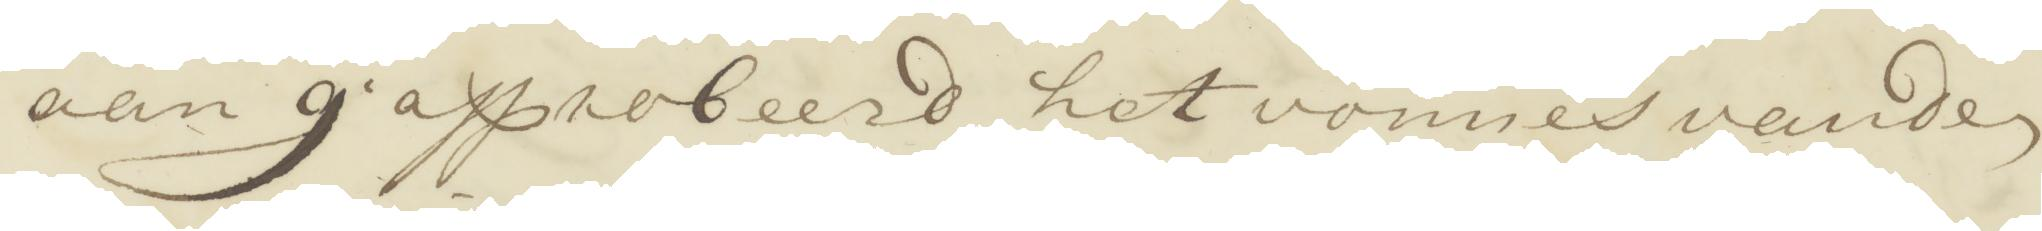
aan g’approbeerd het vonnes vanden
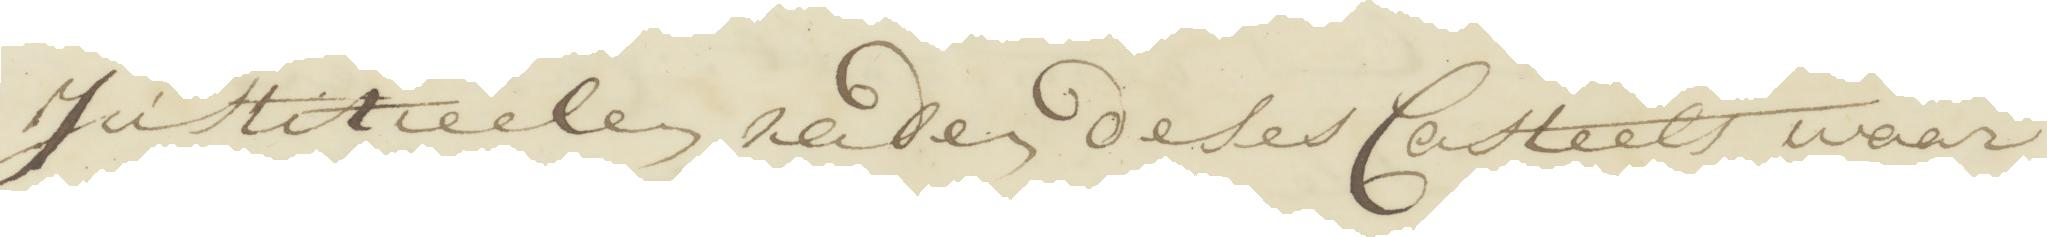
Justitieelen raden deses Casteels waar
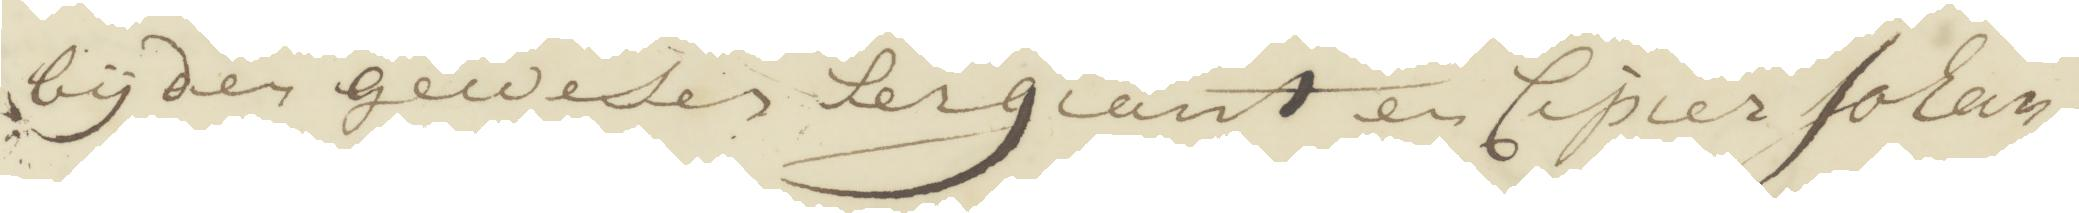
bij den gewesen sergiant en Cipier Johan
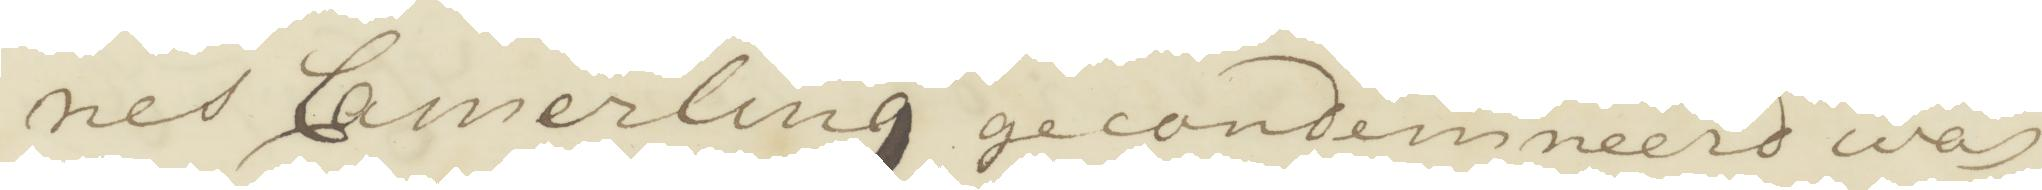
nes Camerling gecondemneerd was
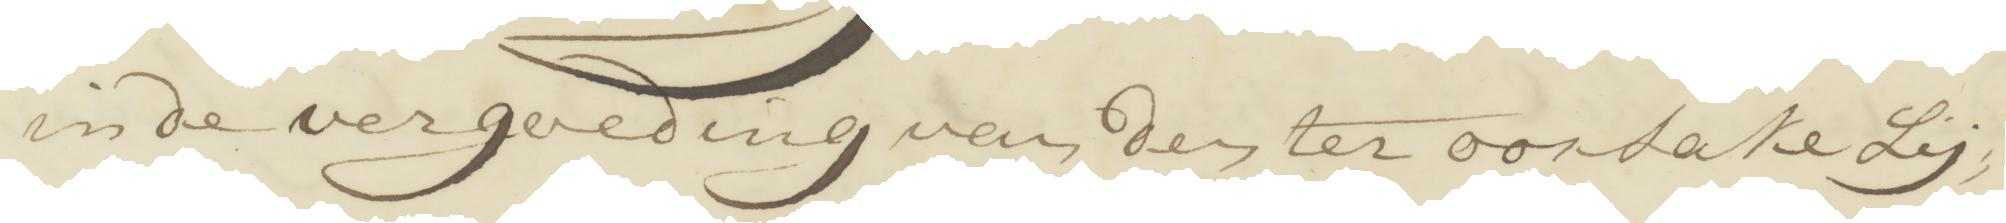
in de vergoeding van den ter oorsake zij„
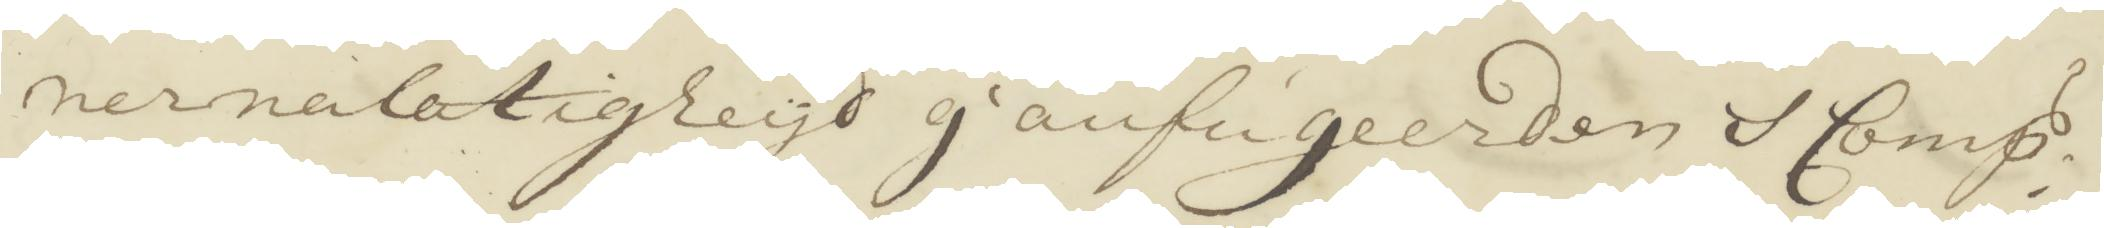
nernalatigheijd g’aufugeerden s Comp„s,
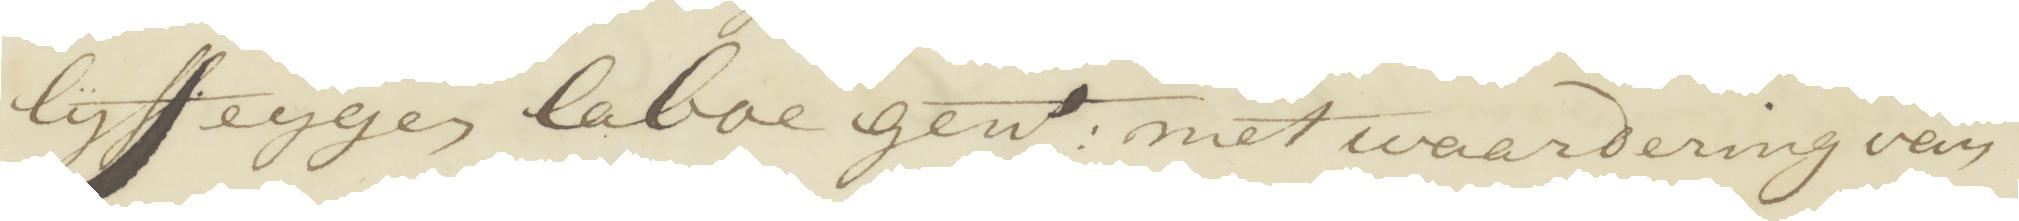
lijffeijgen laboe gen:t met waardering van
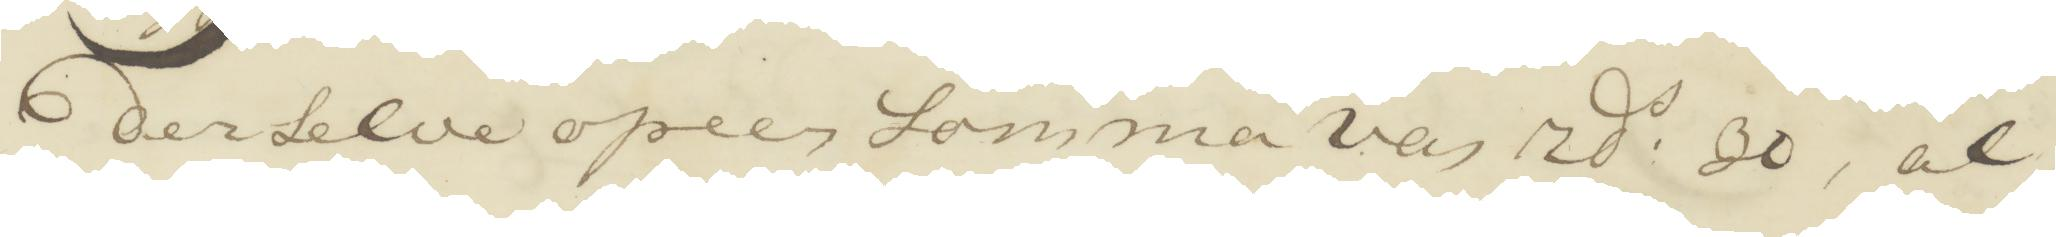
derselve op een somma van rd:s 30, al
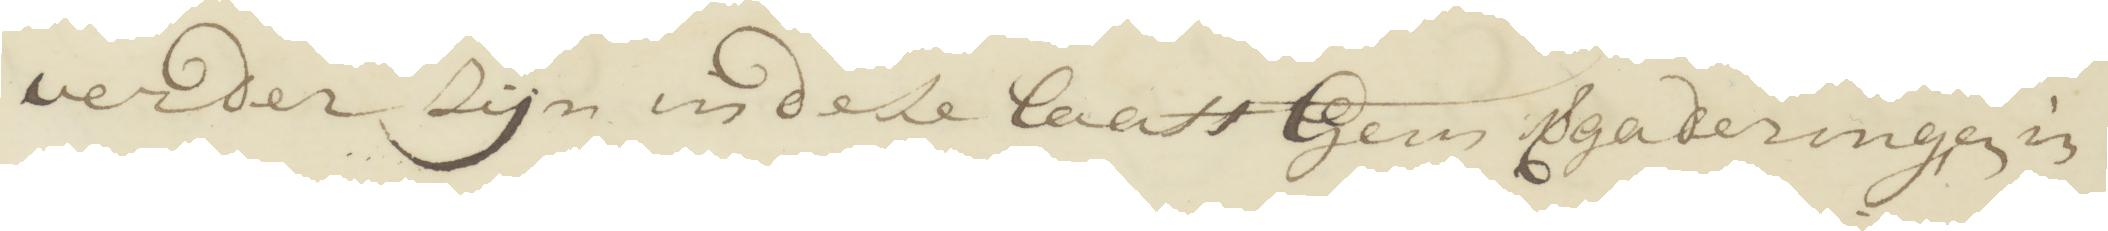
verder zijn in deze laast Gem: vergaderingen in
